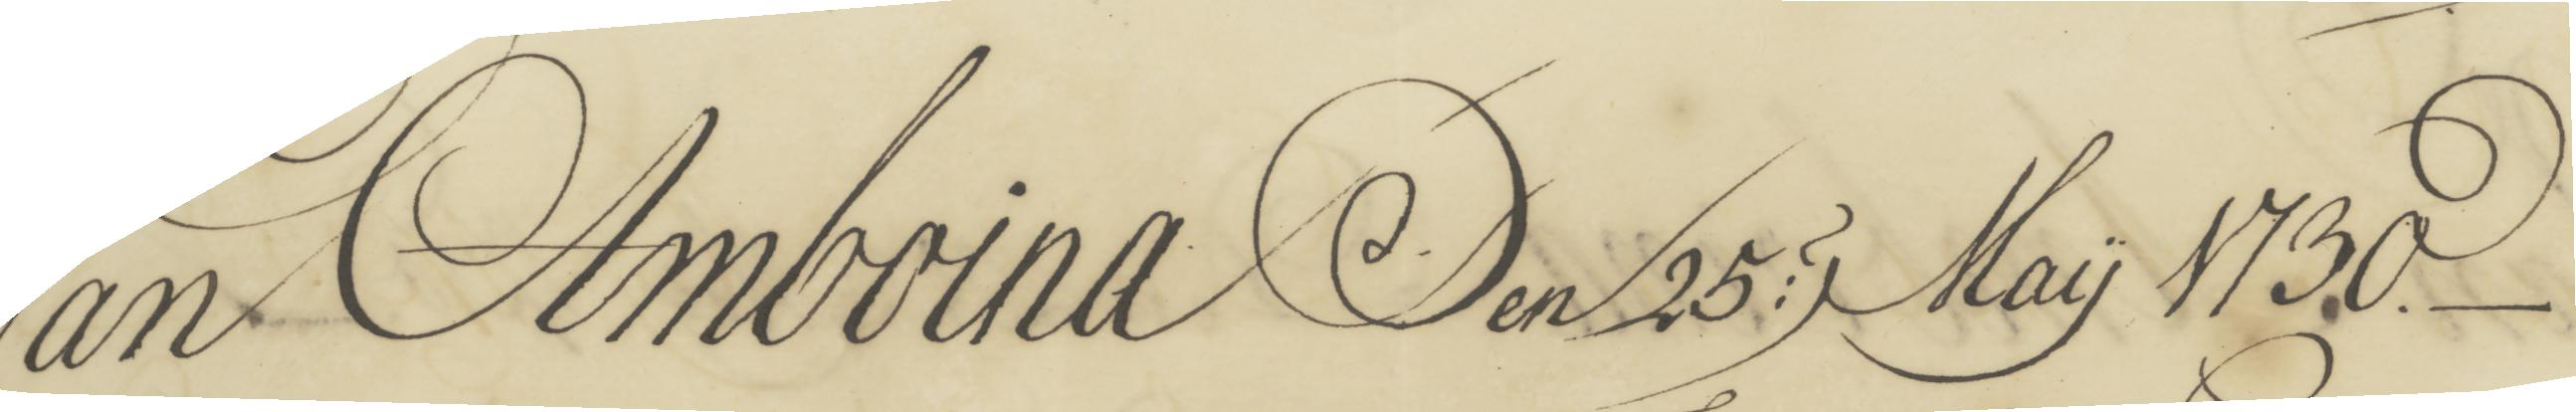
Van Amboina Den 25:e Maij 1730.—
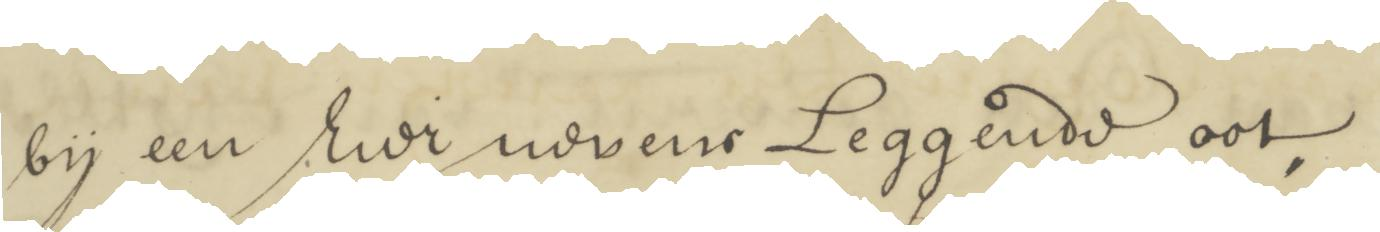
bij een hier nevens Leggende oot„
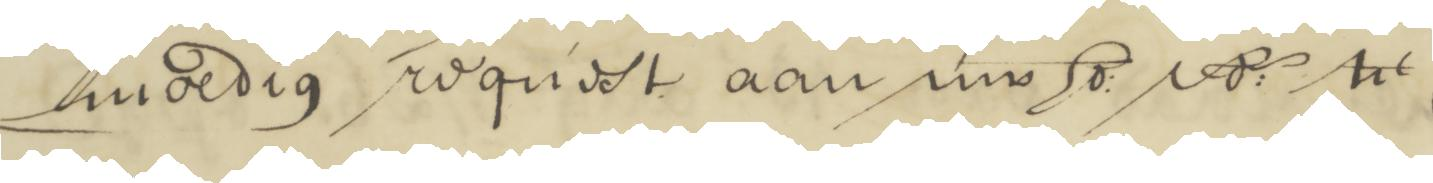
moedig request aan uw ho: Ed: te
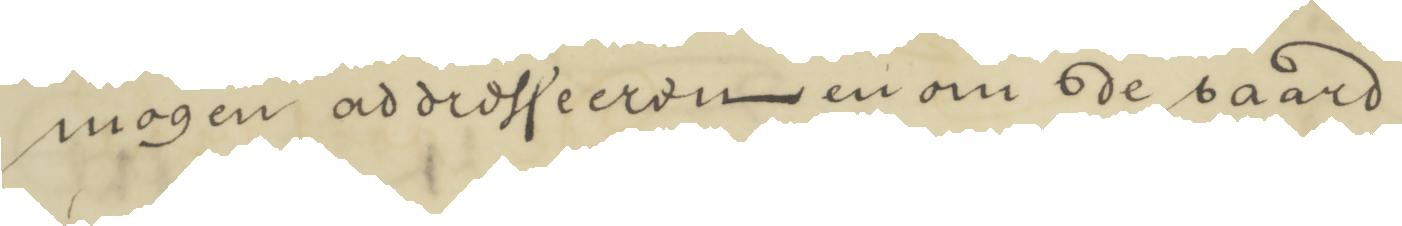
mogen addresseeren en om de vaard
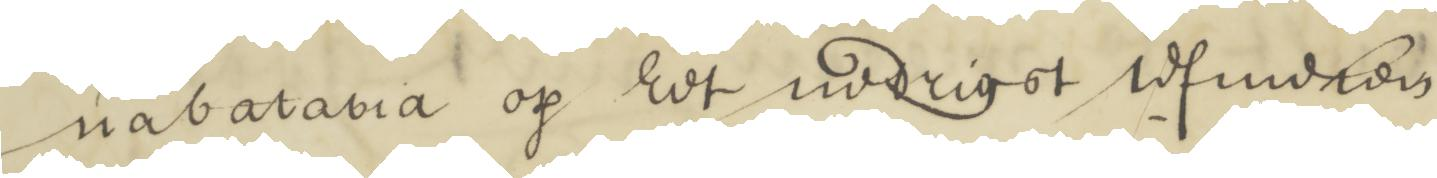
na batavia op het nedrigst tesmeken
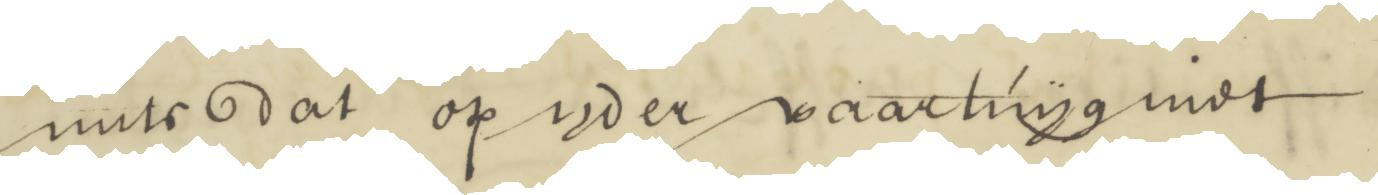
mits dat op yder vaartuijg niet
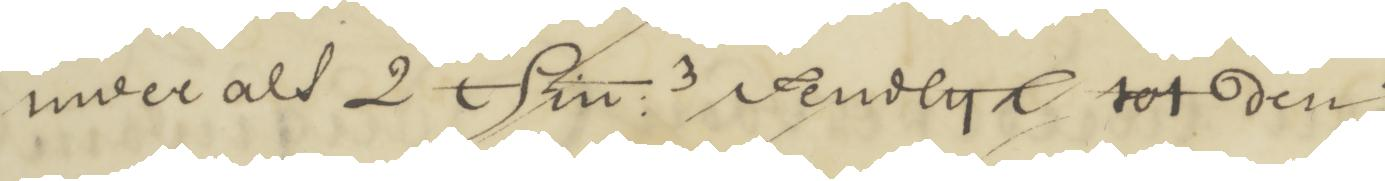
meer als 2 chin:n Eenelyk tot den
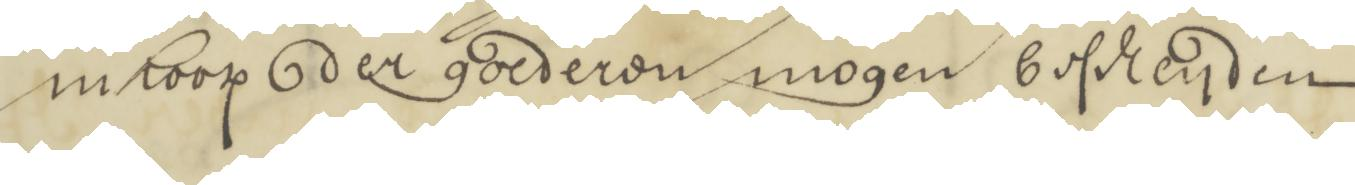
inkoop der goederen mogen bescheyden
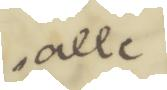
„alle
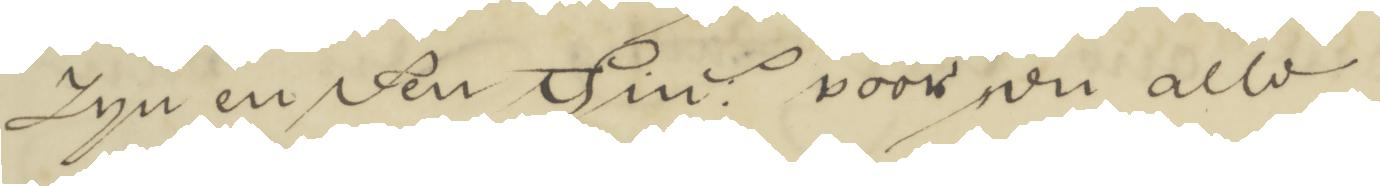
zijn en Een chin:s voor en alle
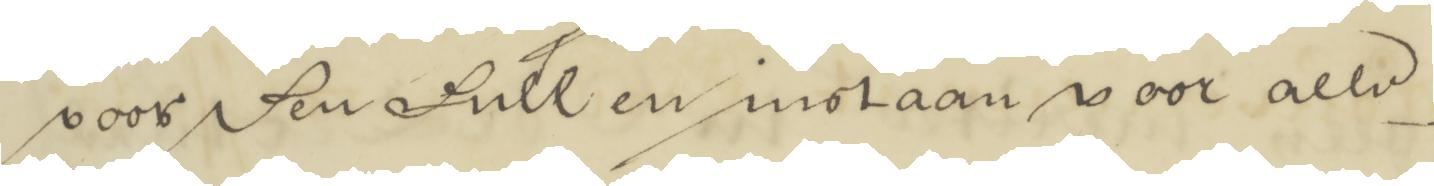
voor Een sullen instaan voor alle
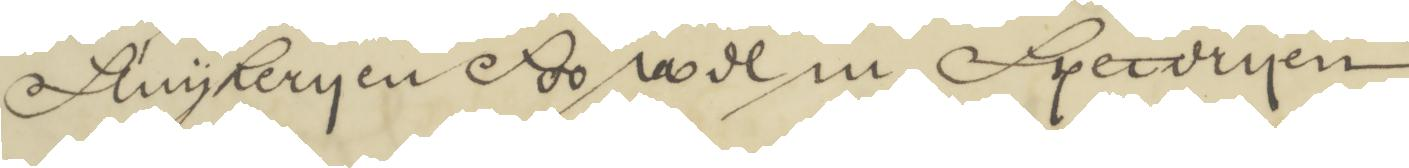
Suijkeryen soo wel in Speceryen
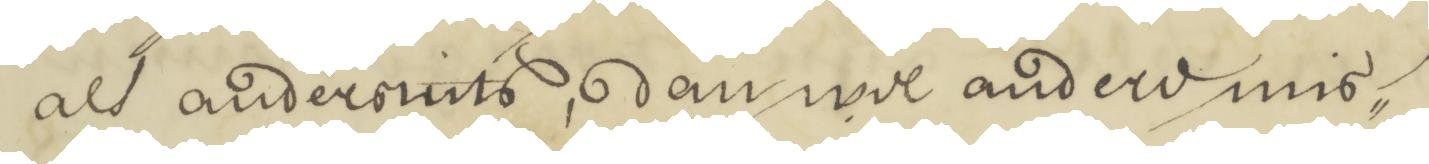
als andersints , dan wel andere mis„
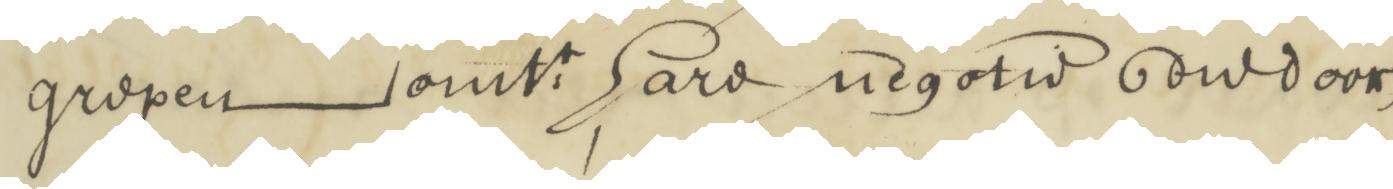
grepen omt:t hare negotie die door
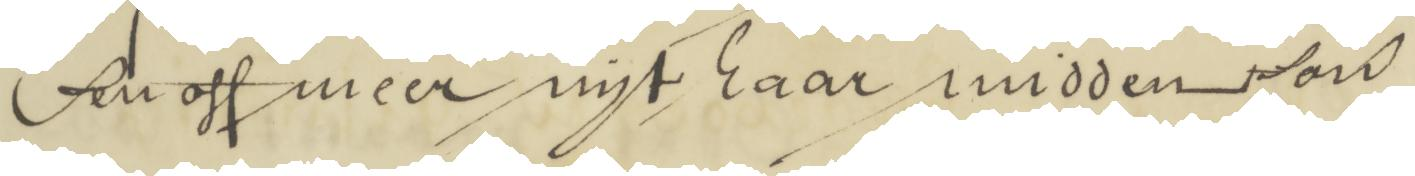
Een off meer uijt haar midden sou
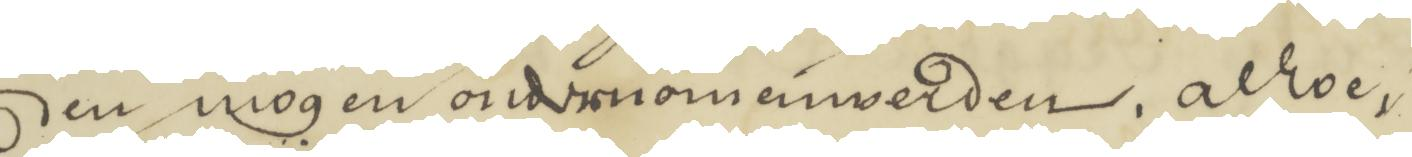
den mogen ondernomenwerden, alhoe„
